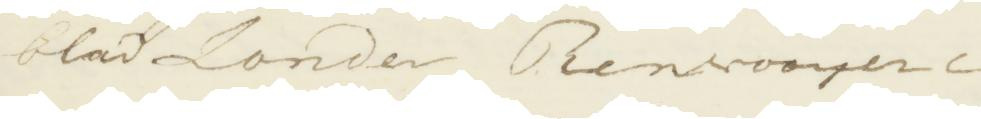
blad Zonder Renvooyen
